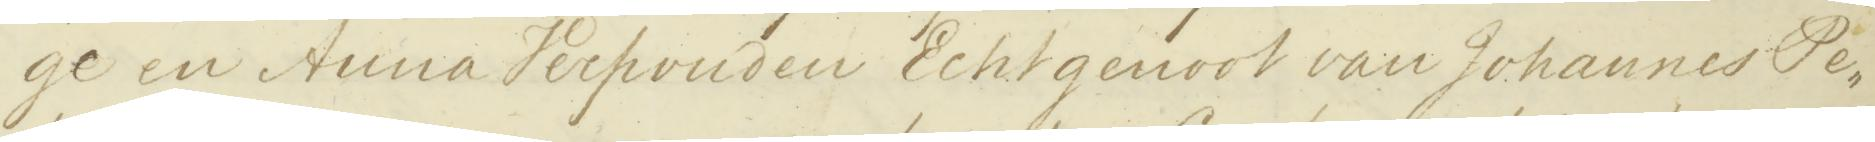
ge en Anna Verponden Echtgenoot van Johannes Pe„
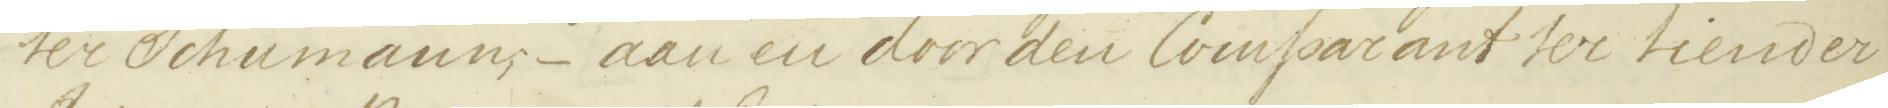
ter Schumanns - aan en door den Comparant ter tiender
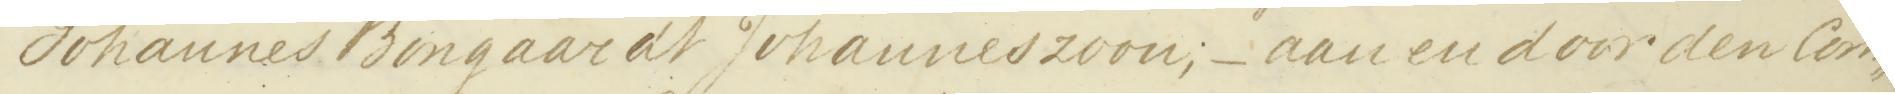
Iohannes Bongaardt Johanneszoon; - aan en door den Com„
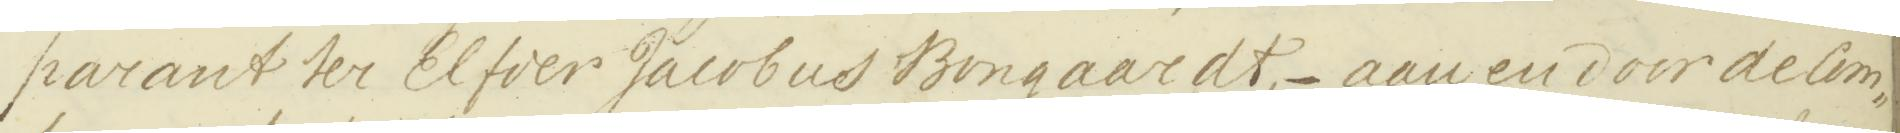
parant ter Elfder Jacobus Bongaardt, -aan en door de Com„
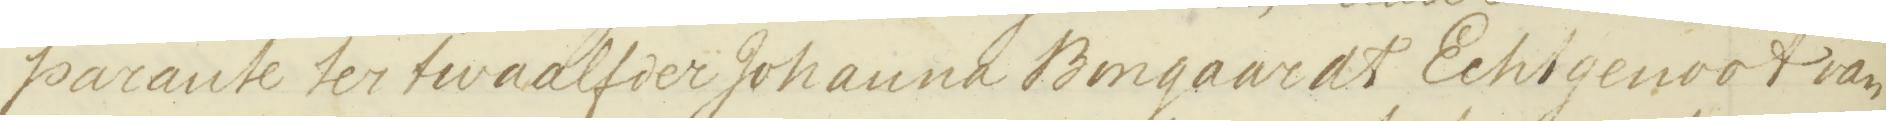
parante ter twaalfder Johanna Bongaardt Echtgenoot van
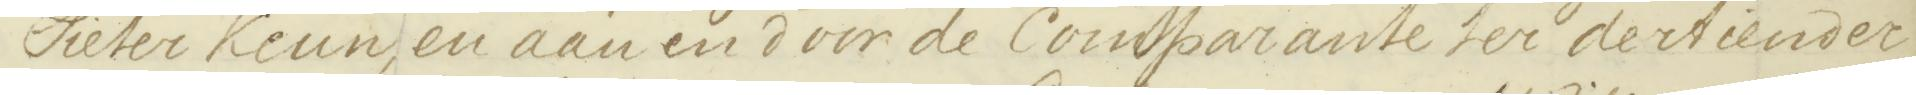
Pieter Keun en aan en door de Comparante ter dertiender
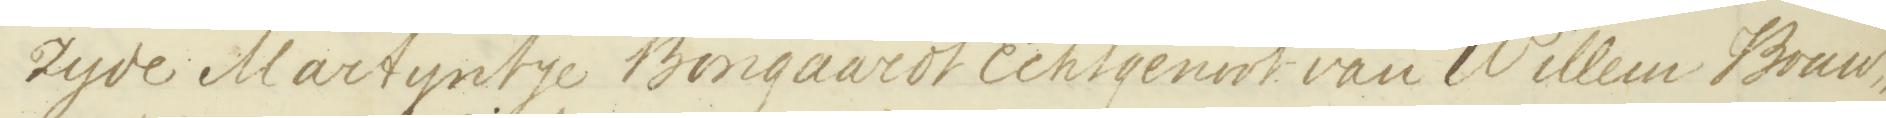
zyde Martyntje Bongaards Echtgenoot van Willem Bouw„
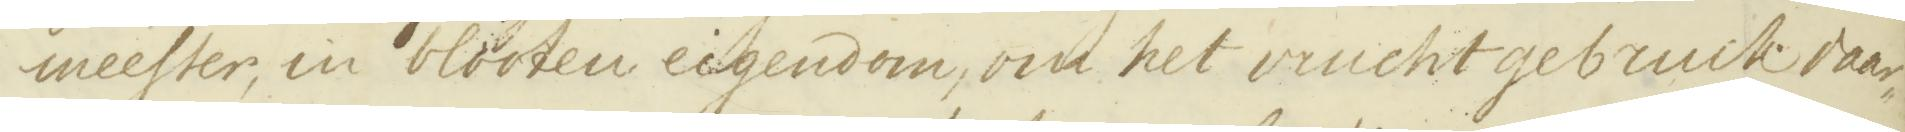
meester, in blooten eigendom, om het vrucht gebruik daar„
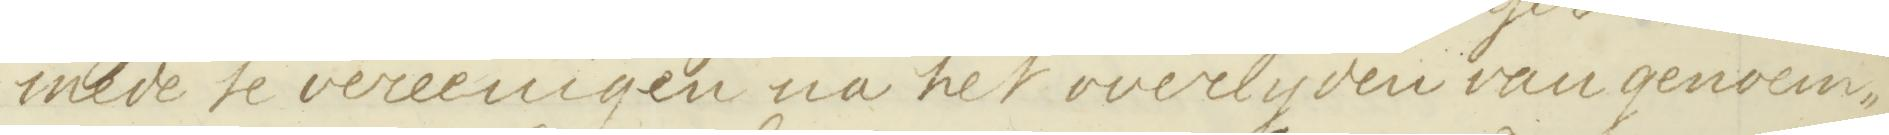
mede te vereenigen na het overlyden van genoem„
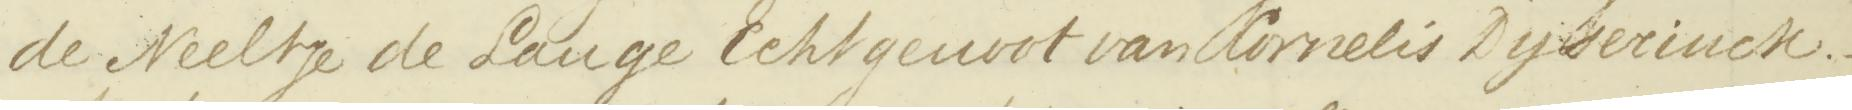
de Neeltje de Lange Echtgenoot van Cornelis Dijserinck
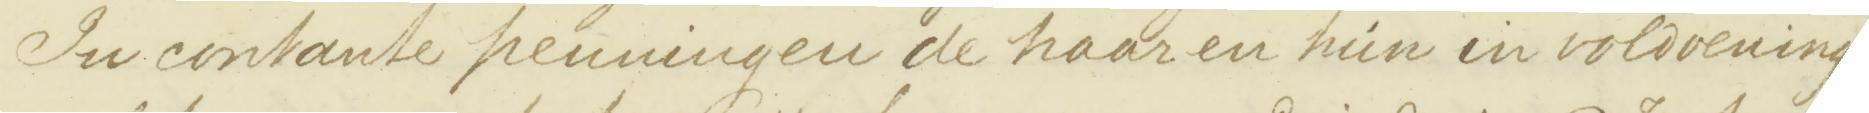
In contante penningen de haar en hun in voldoening
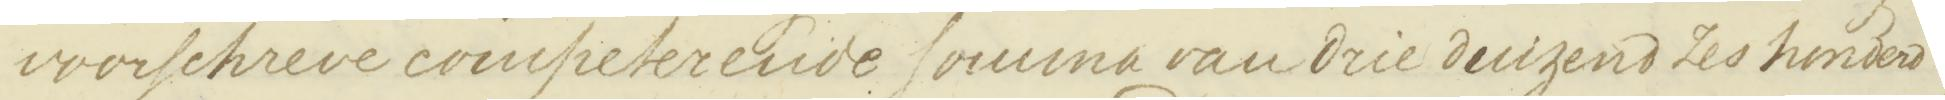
voorschreve competerende somma van drie duizend zes honderd
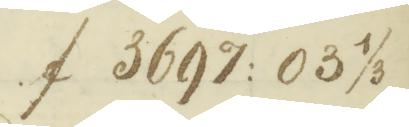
ƒ 3697: 03 1/3
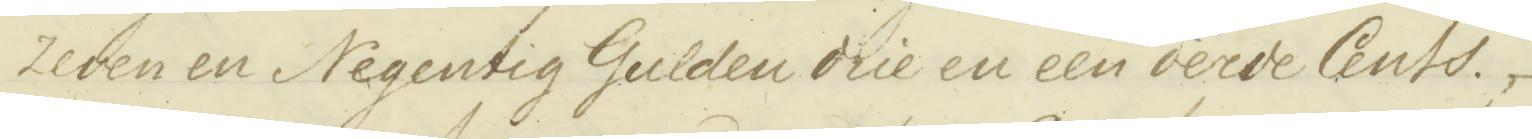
zeven en Negentig Gulden drie en een derde Cents.
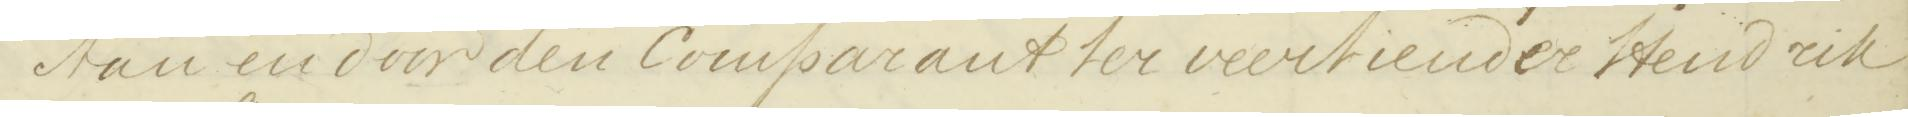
Aan en door den Comparant ter veertiender Hendrik
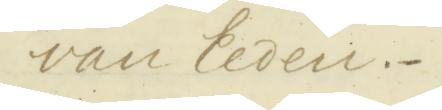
van Eeden. -
